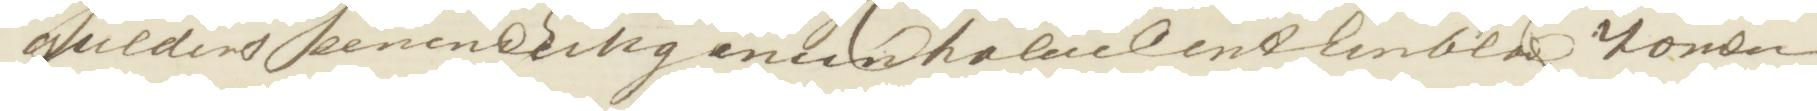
guldens eenendertig en een halve cent Eenblad zonder
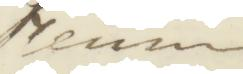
renv—
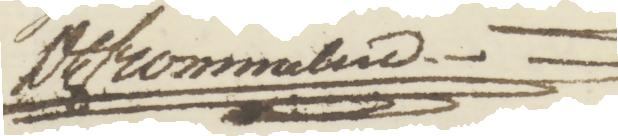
D.F Crommelin
